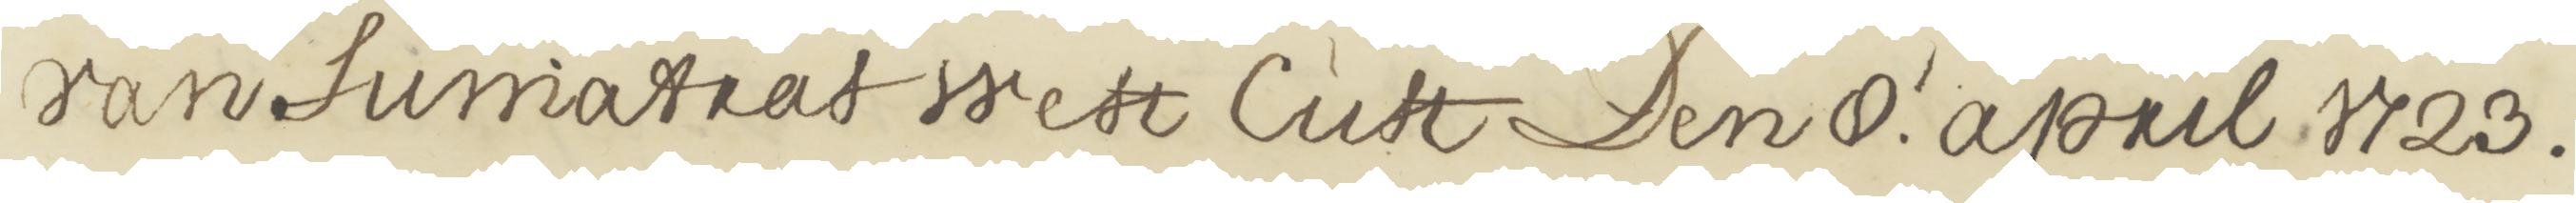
van sumatras West Cust Den 8.' april 1723.
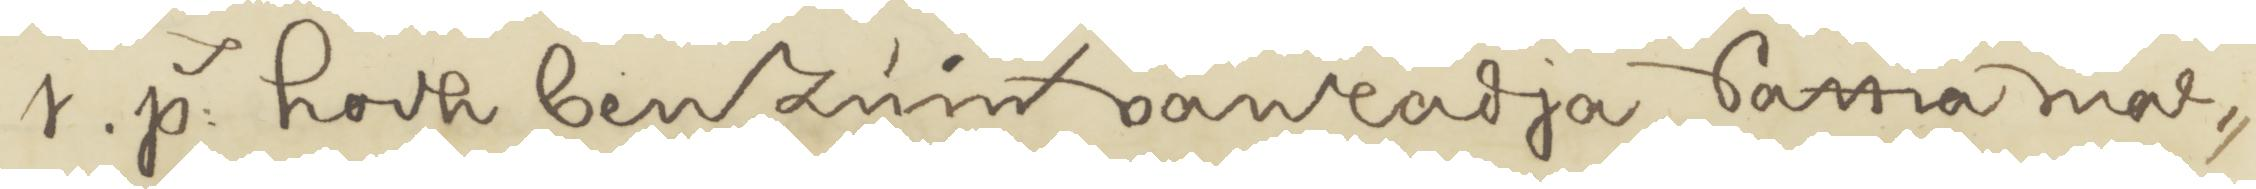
1. p:s koek benzuin van radja sattia moe„
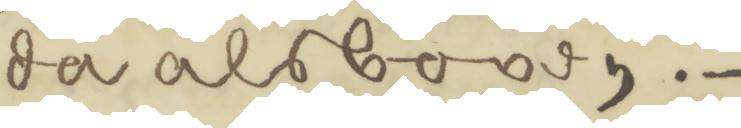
da als boven.—
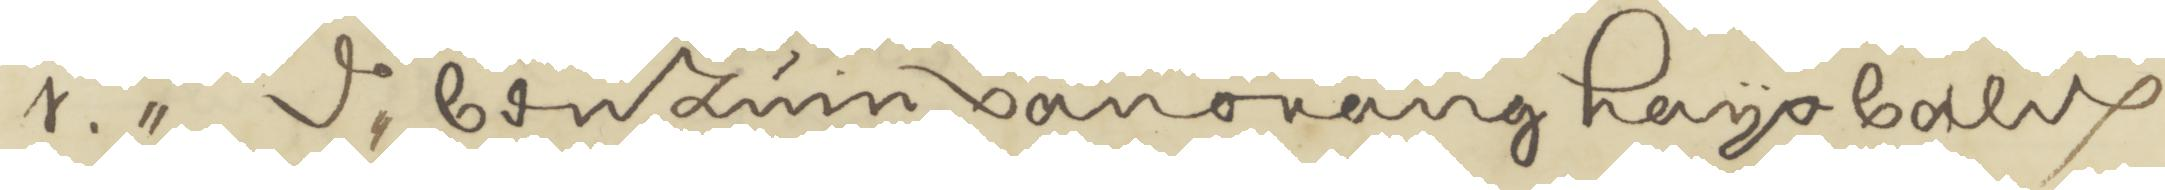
.1 „ _„o benzuin van orang kaijo bale
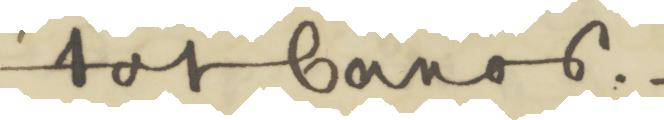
tot baros.—
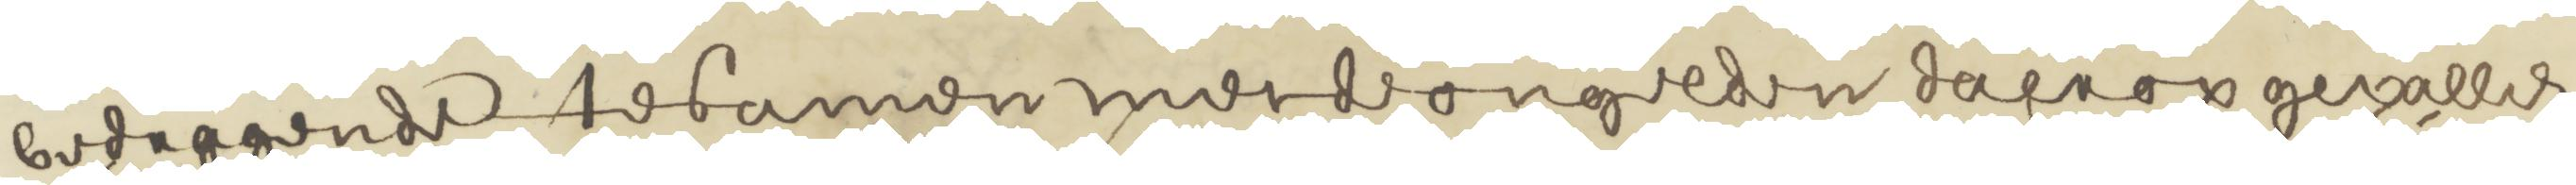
bedragende tesamen met de ongelden daerop gevallen
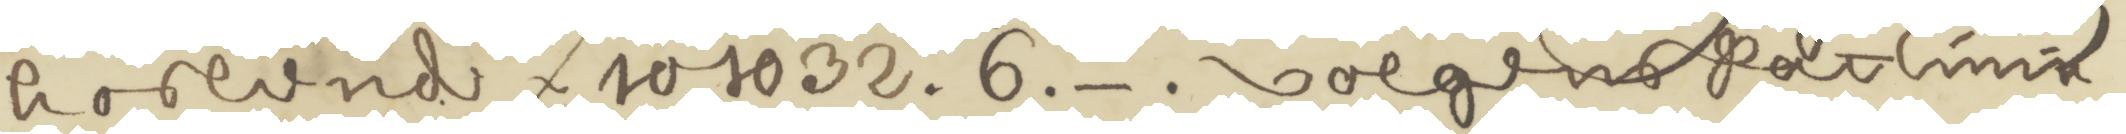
kostende ƒ101032.6.—. volgens factuur
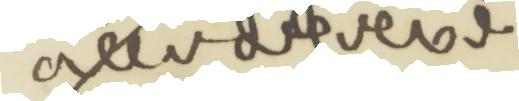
alle deselve
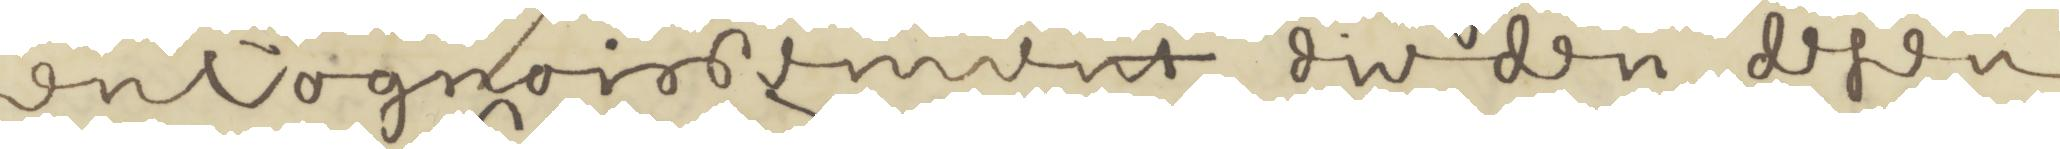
en Cognoissement, die den desen
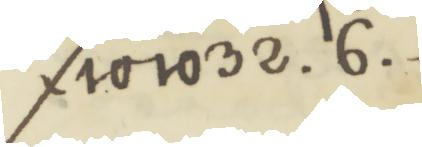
ƒ101032.6.—.—
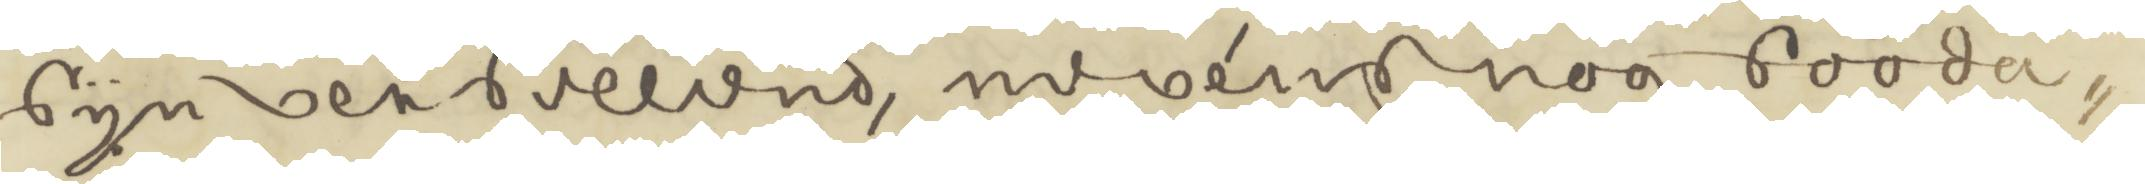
sijn versellend, nevens nog sooda„
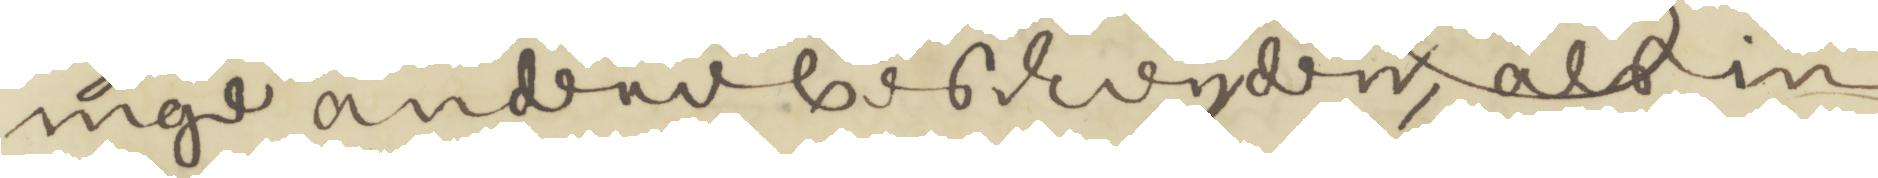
nige andere bescheijden, als in
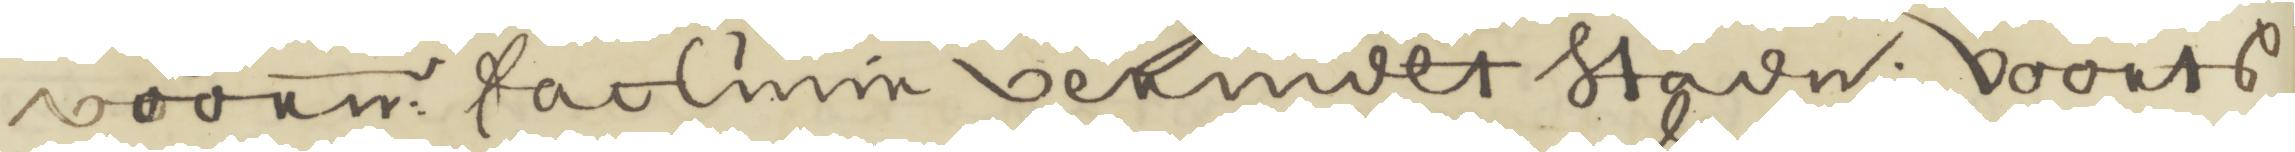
voorn:e factuur vermelt staen; voorts
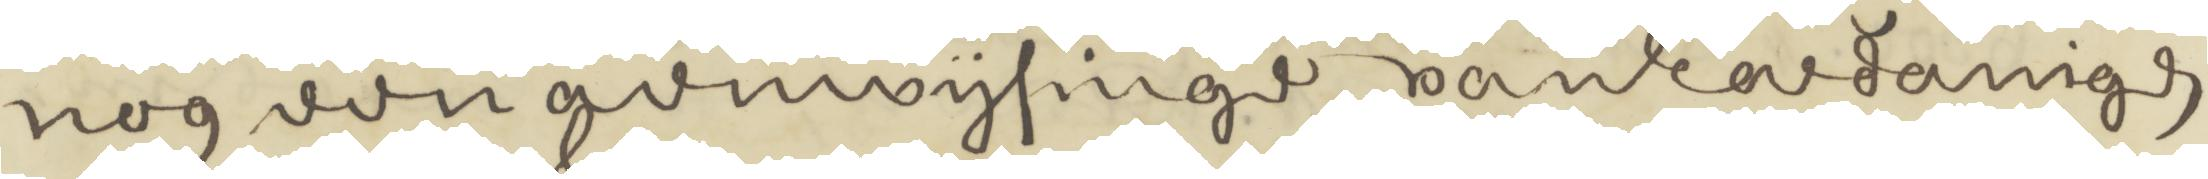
nog een aenwijsinge van hoedanigen
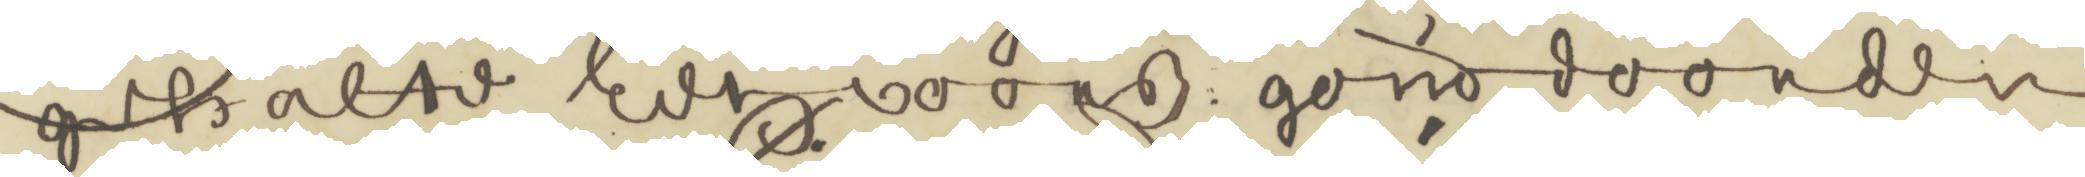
gehalte het voors: goud door den
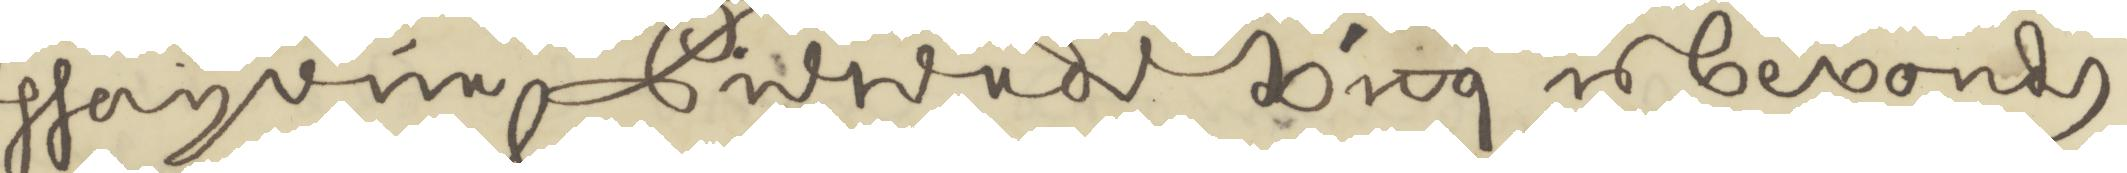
essaijeur Pieter de Vicq is bevonden
